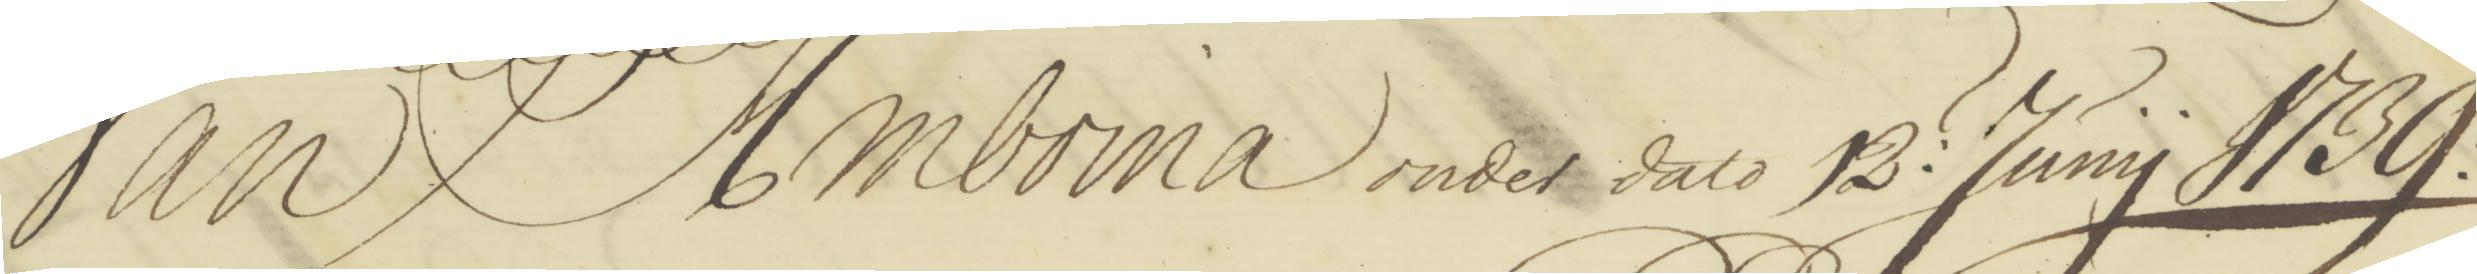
Van Amboina onder dato 12:' Junij 1739:
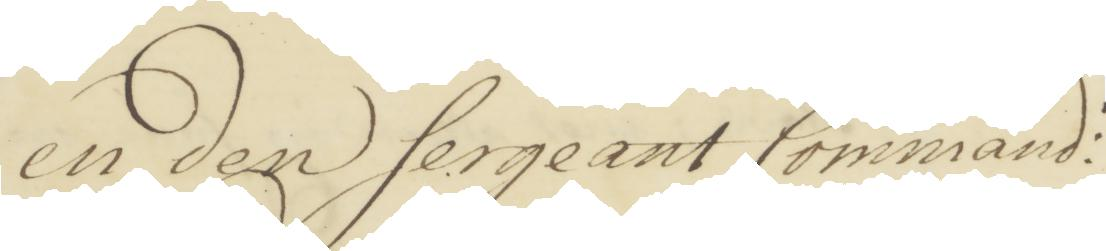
en den sergeant Command:r
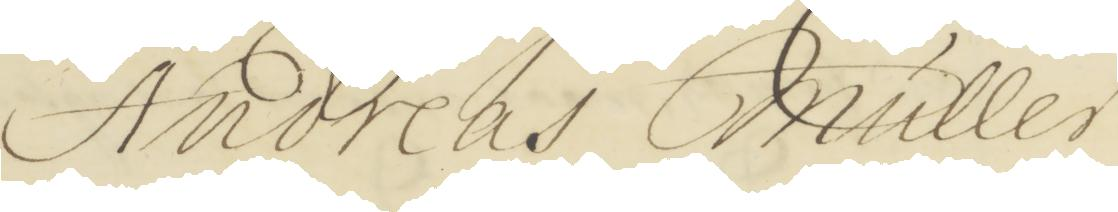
Andreas Muller
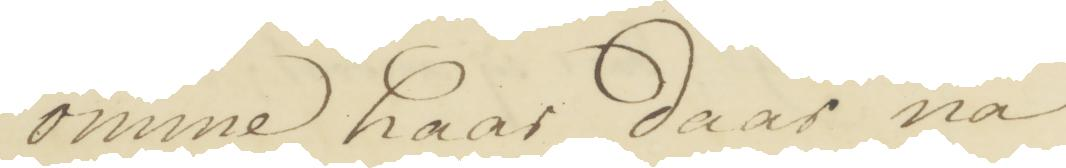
omme haar daar na
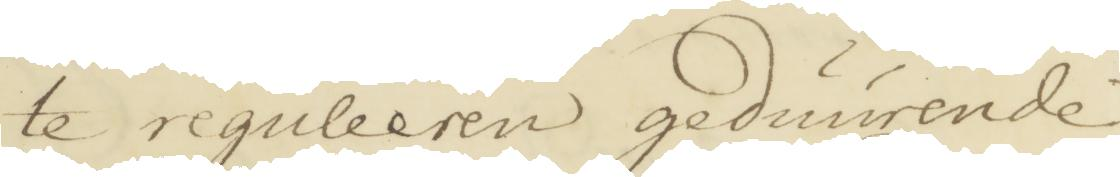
te reguleeren geduurende
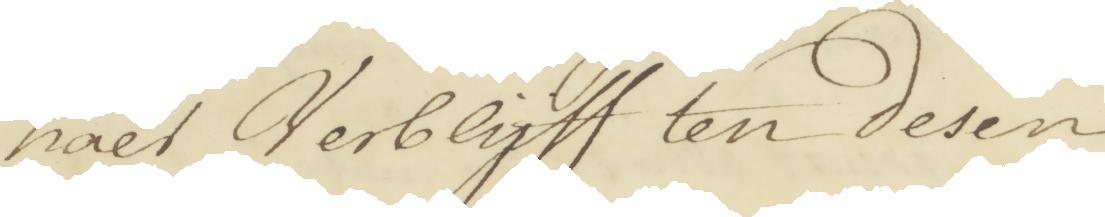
haer Verblijff ten desen
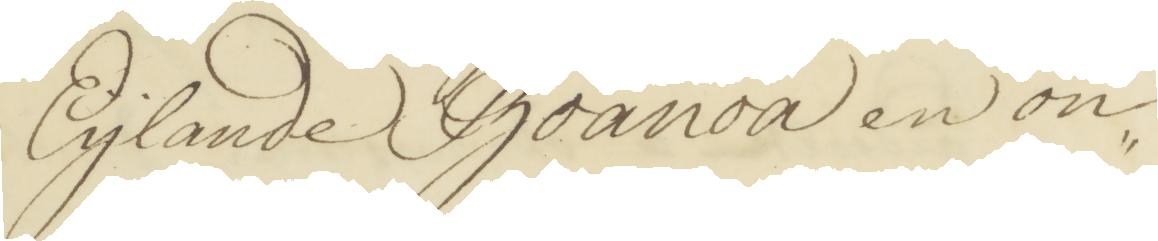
Eijlande Boanoa en on„
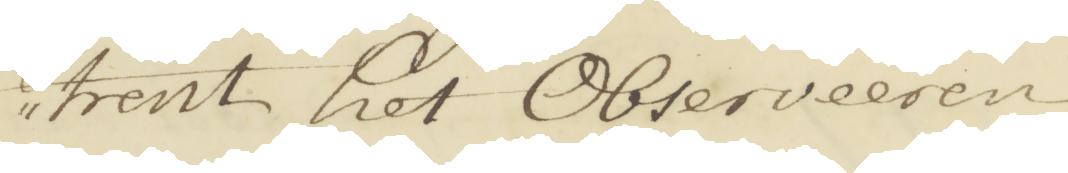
„trent het Observeeren
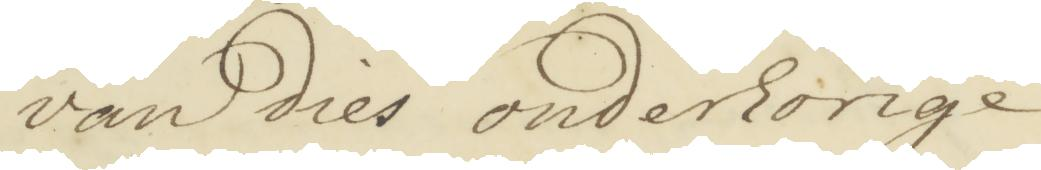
van dies onderhorige
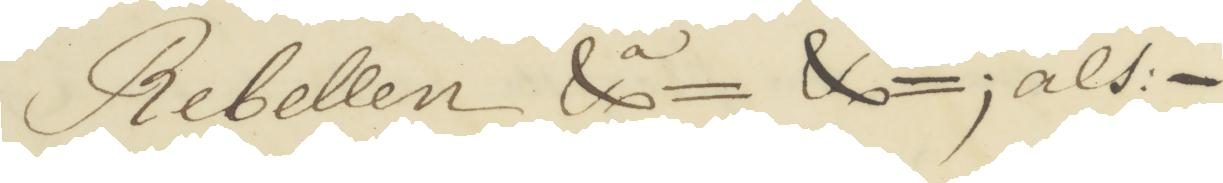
Rebellen &=a &=a; als: —
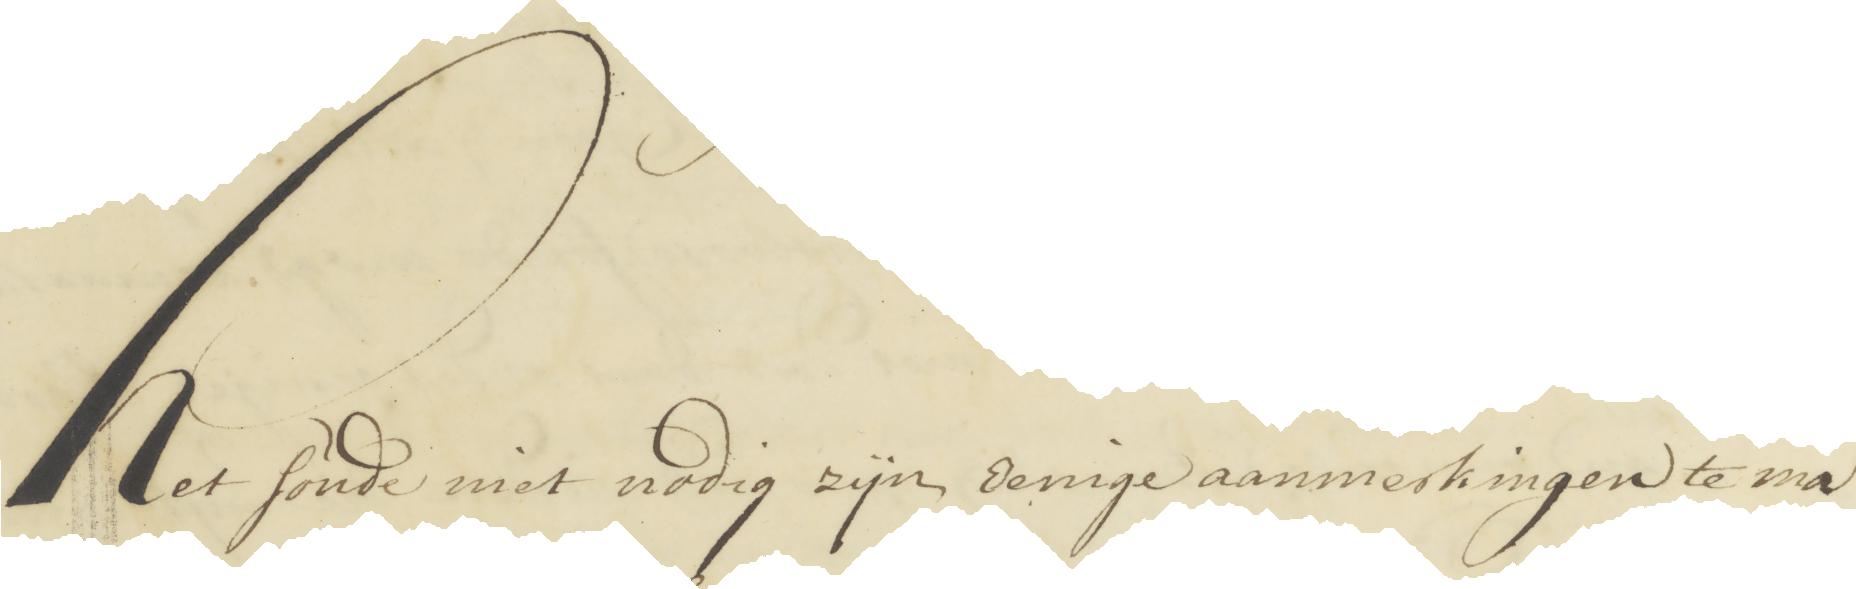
Het soude niet nodig zijn Eenige aanmerkingen te ma
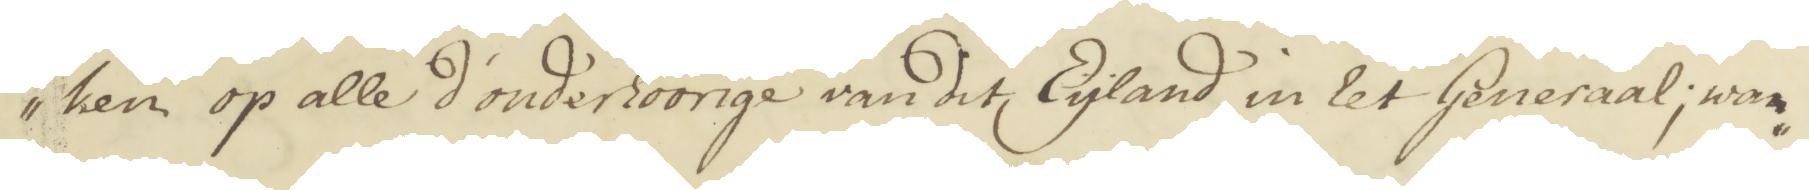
„ken op alle d’onderhoorige van dit Eijland in het Generaal; wan„
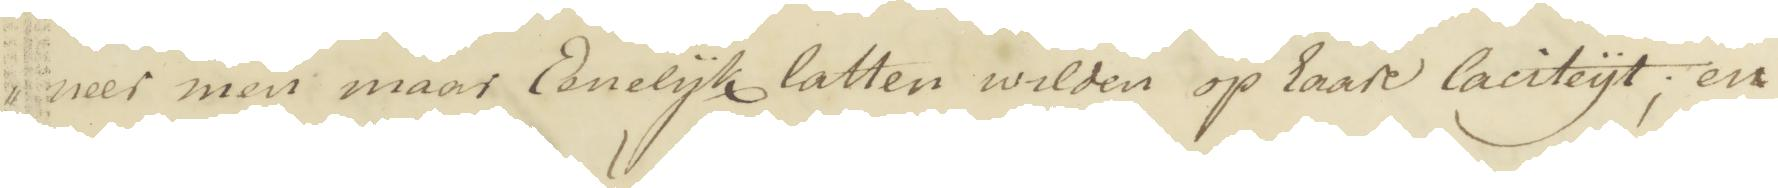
„neer men maar Eenelijk latten wilden op haare laciteijt; en
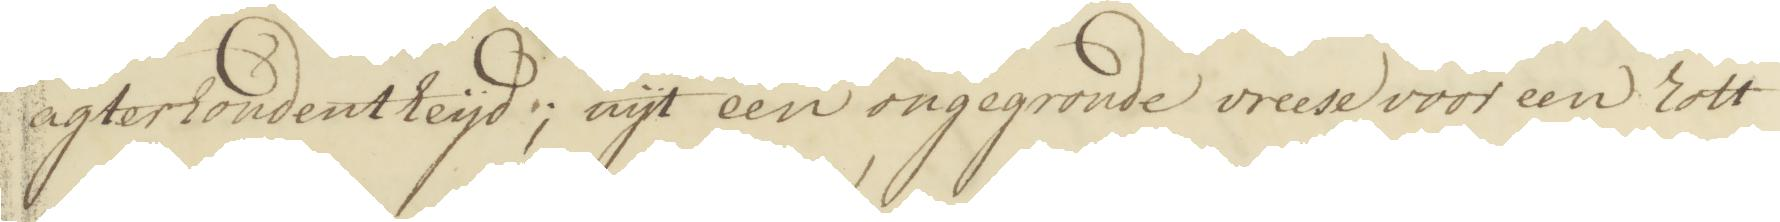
agterhoudentheijd; uijt een ongegronde vreese voor een rott
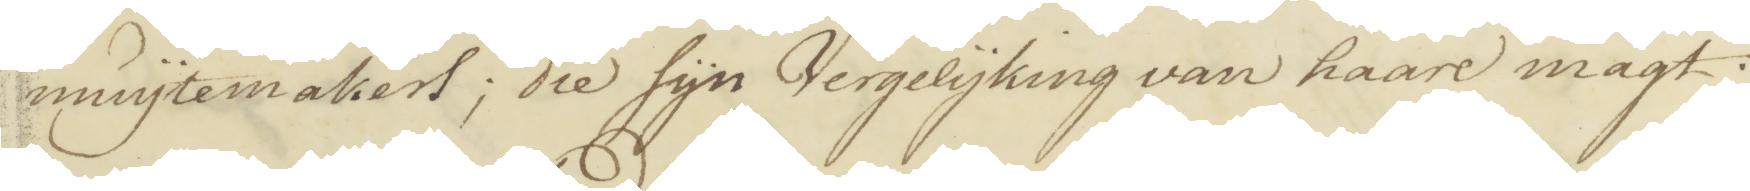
muijtemakers; die sijn vergelijking van haare magt;
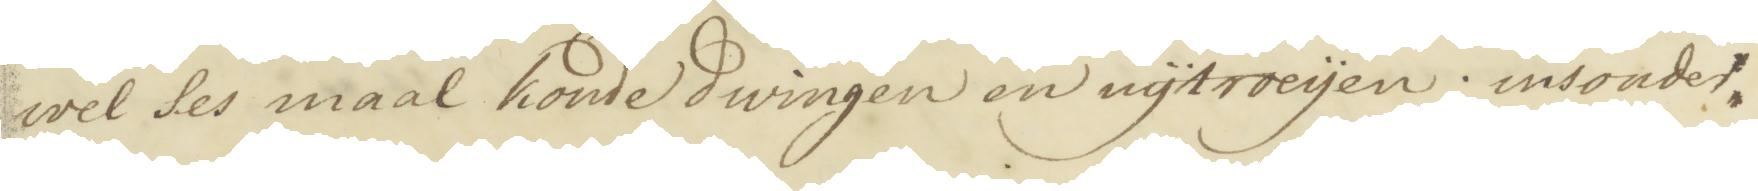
wel ses maal konde dwingen en uijtroeijen; insonder„
